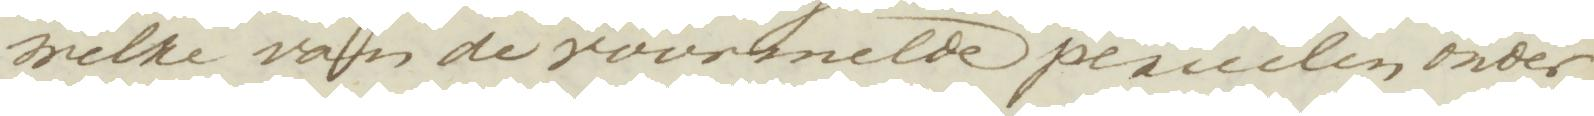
welke van de voormelde perceelen onder
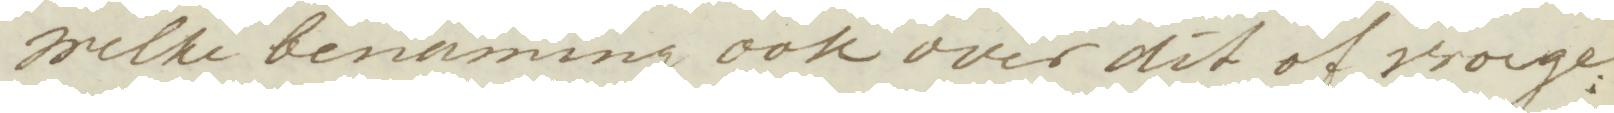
welke benaming ook over dit of vroege„
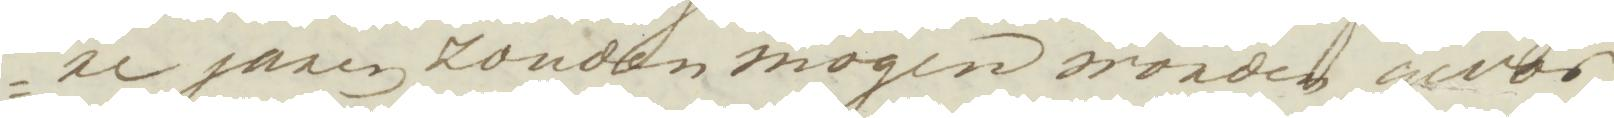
„re jaren zouden mogen worden gevor
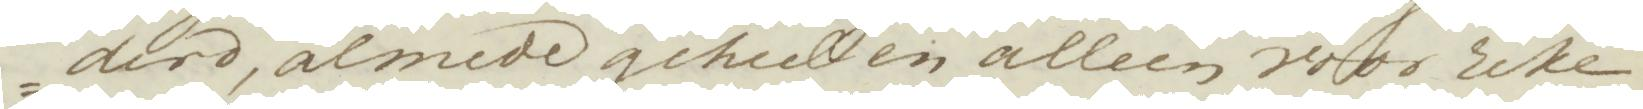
„derd, almede geheel en alleen voor reke
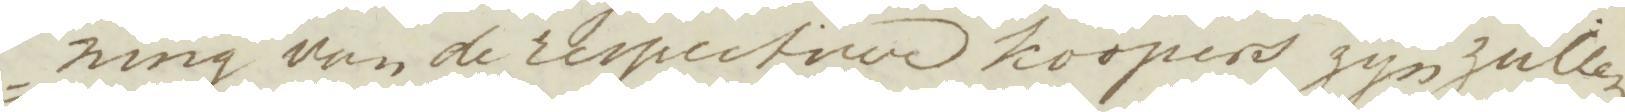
„ning van de respective koopers zyn zullen
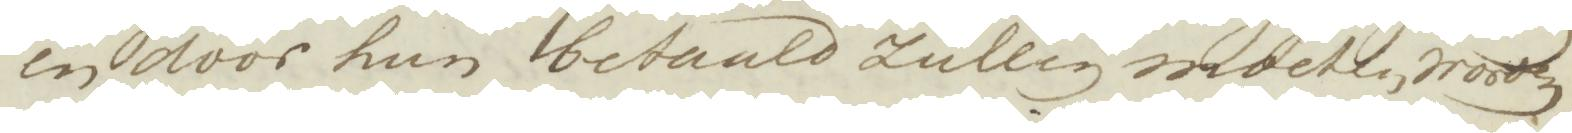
en door hun betaald zullen moeten worden
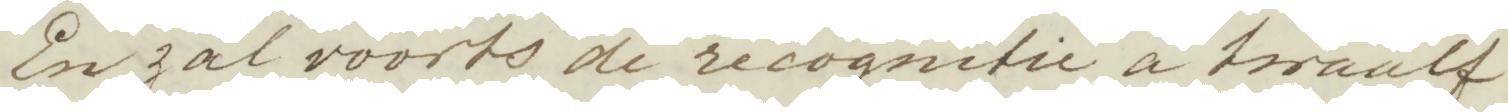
En zal voorts de recognitie a twaalf
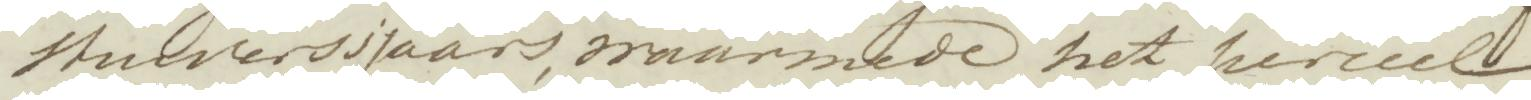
stuivers s'jaars, waarmede het perceel
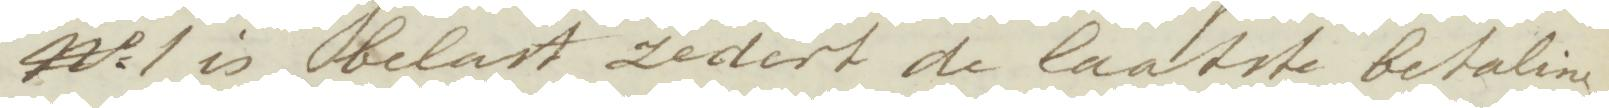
N=o 1 is belast, zedert de laatste betaling
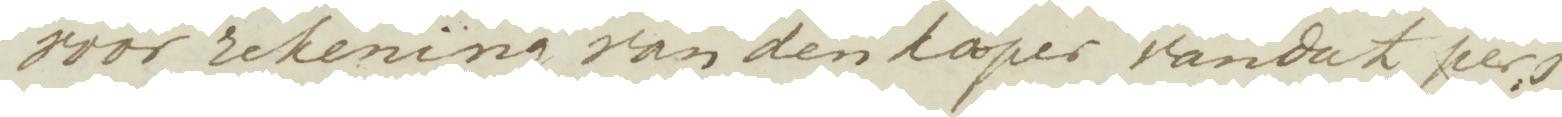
voor rekening van den kooper van dat per„
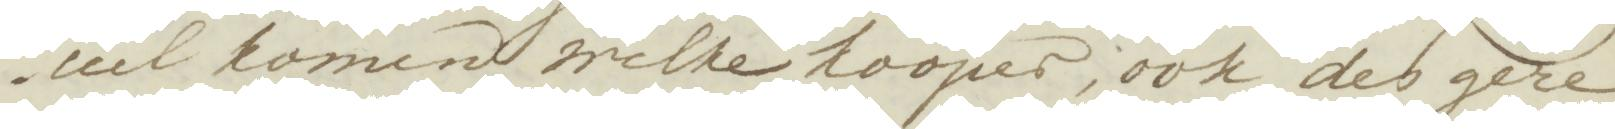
-ceel komen, welke kooper, ook, des gere
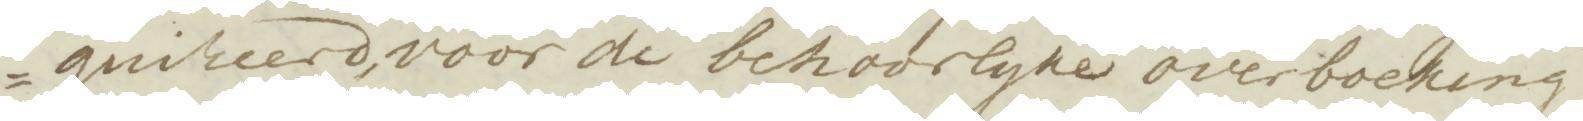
„quireerd, voor de behoorlijke overboeking
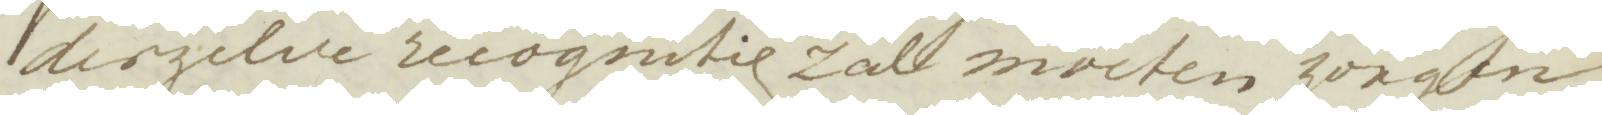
derzelve recognitie zal moeten zorgen,
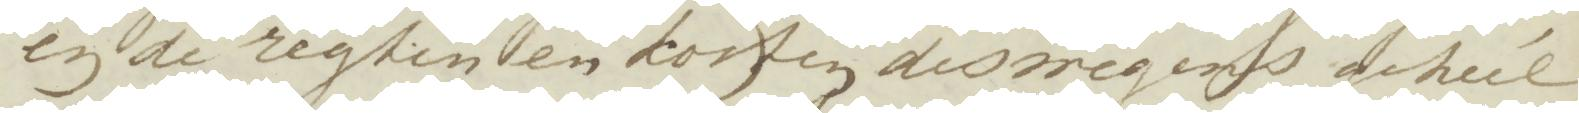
en de regten en kosten des wegens geheel
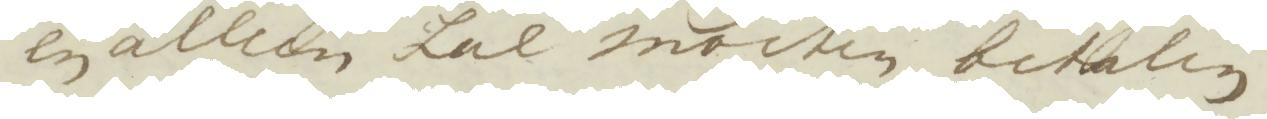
en alleen zal moeten betalen
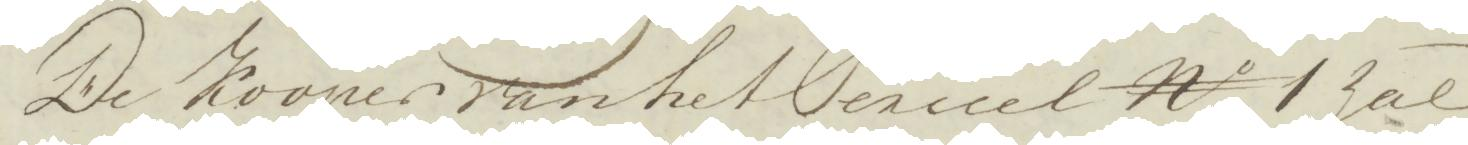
DeKkooper van het Perceel N.=o 1 zal
